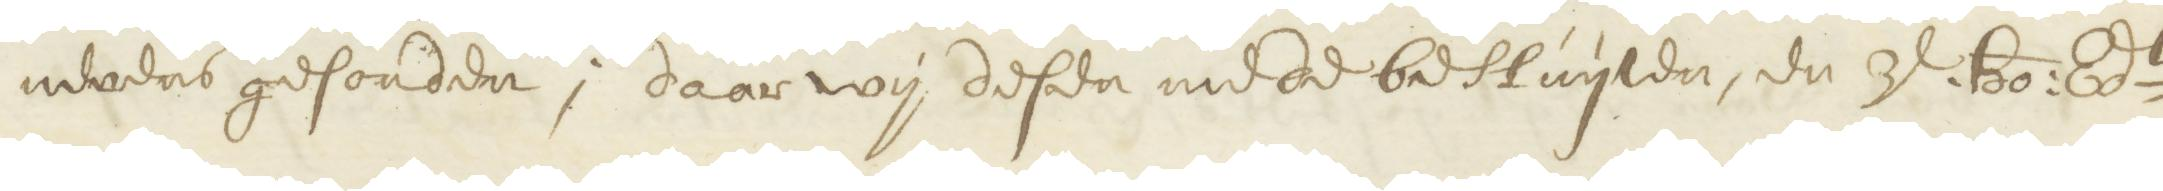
nevens gesonden; daar wij desen mede besluijten, en V .ho: Ed=le
